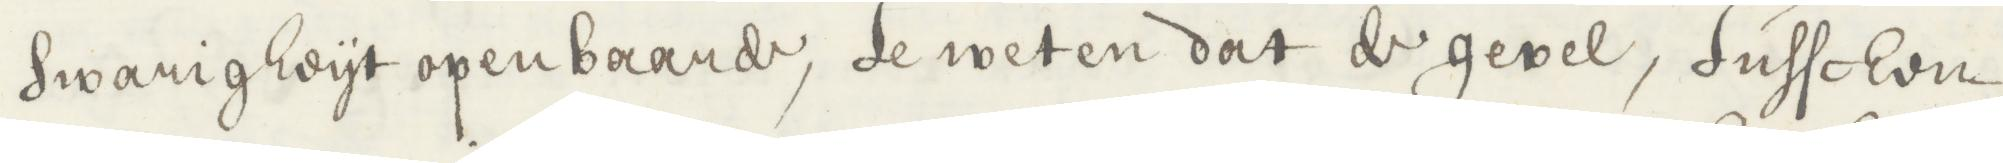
swarigheijt open baarde, te weten dat de gevel, tusschen
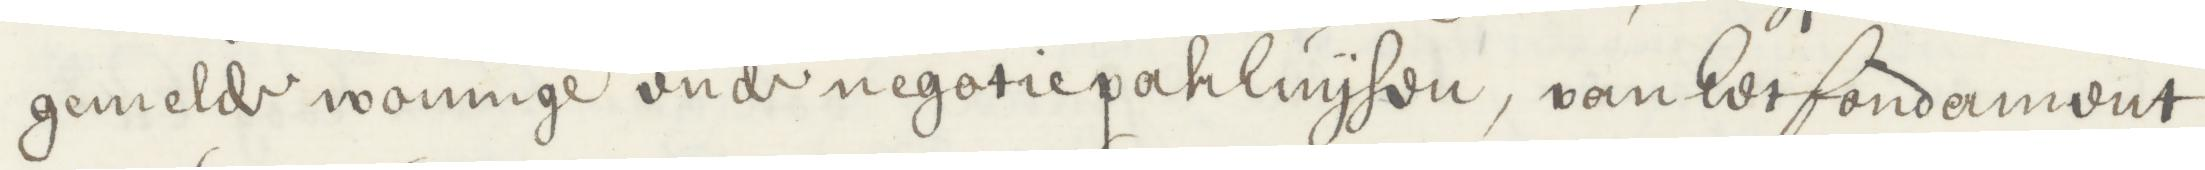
gemelde woninge en de negotiepakhuijsen, van het fondament
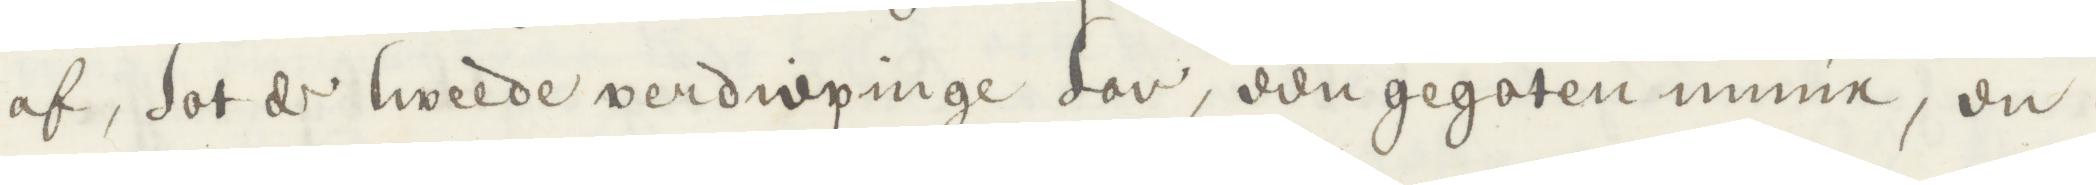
af, tot de tweede verdiepinge toe, een gegoten muur, en
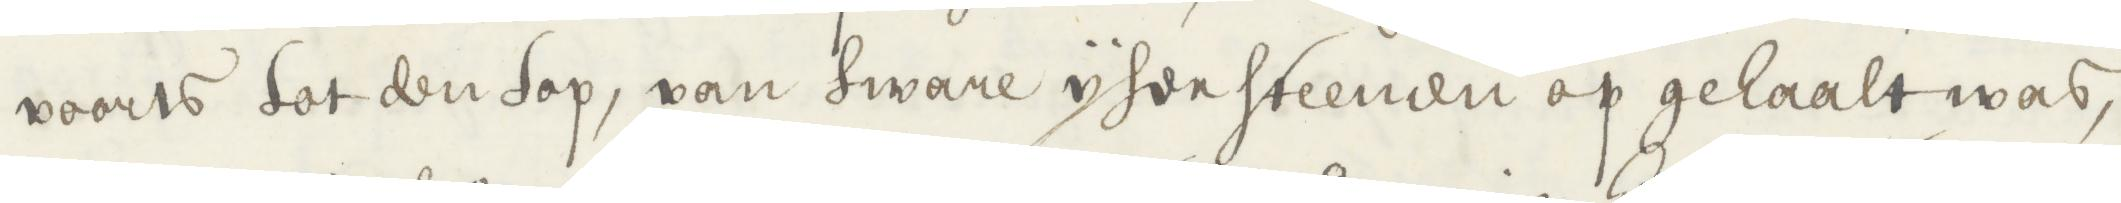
voorts tot den top, van sware ijsersteenen op gehaalt was,
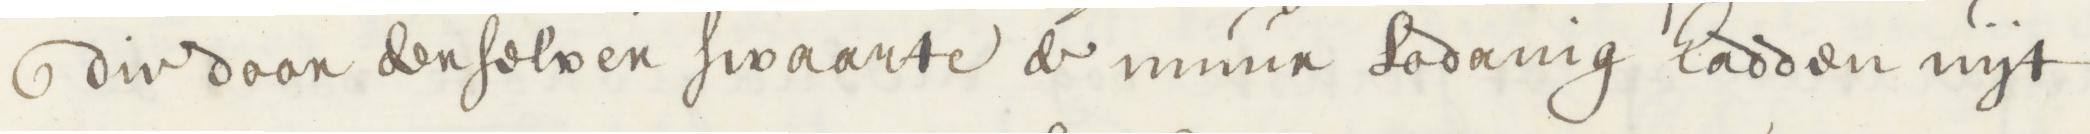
die door derselver swaarte de muur sodanig hadden uijt
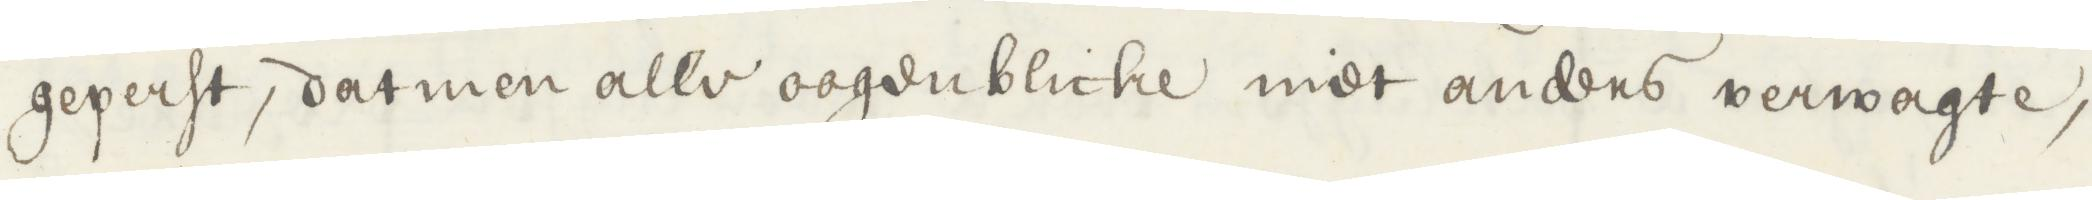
geperst, dat men alle oogenblicke niet anders verwagte,
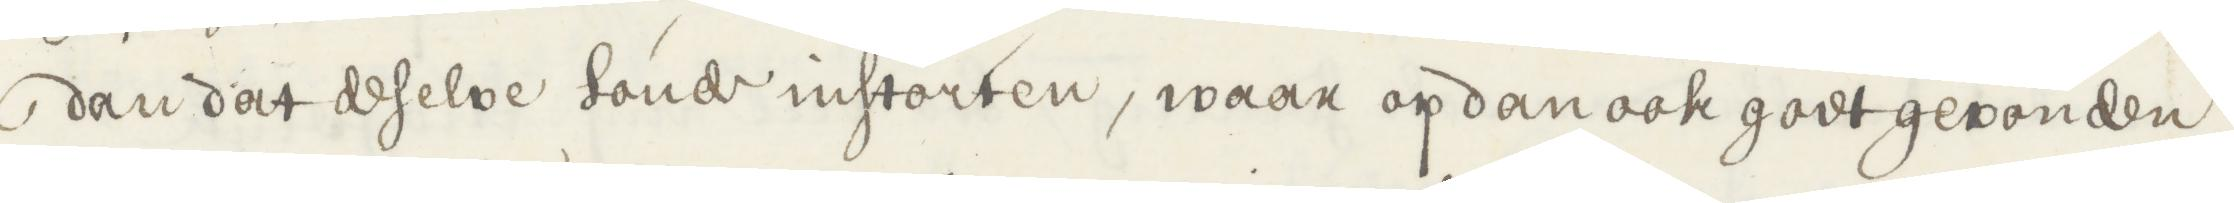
dan dat deselve soude instorten, waar op dan ook goet gevonden
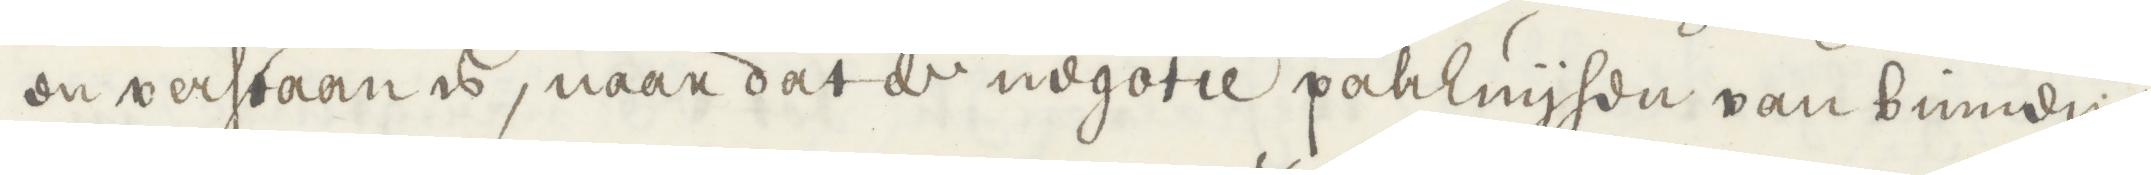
en verstaan is, naar dat de negotie pakhuijsen van binnen
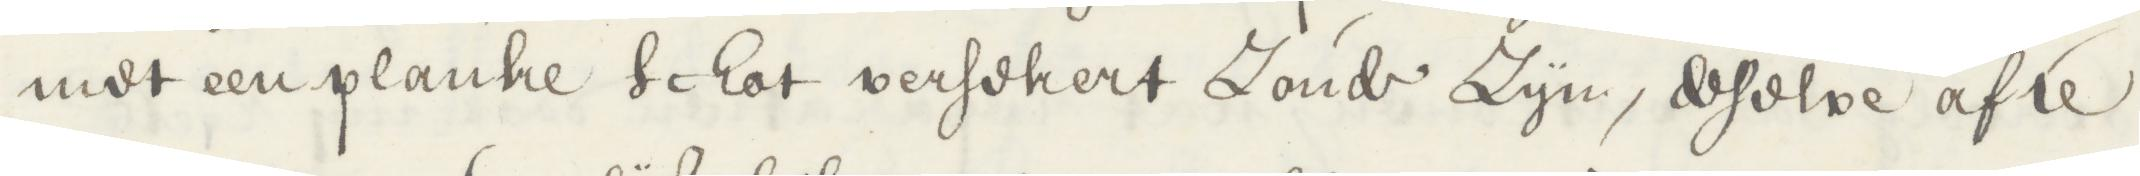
met een planke schot versekert zoude zijn, deselve afte
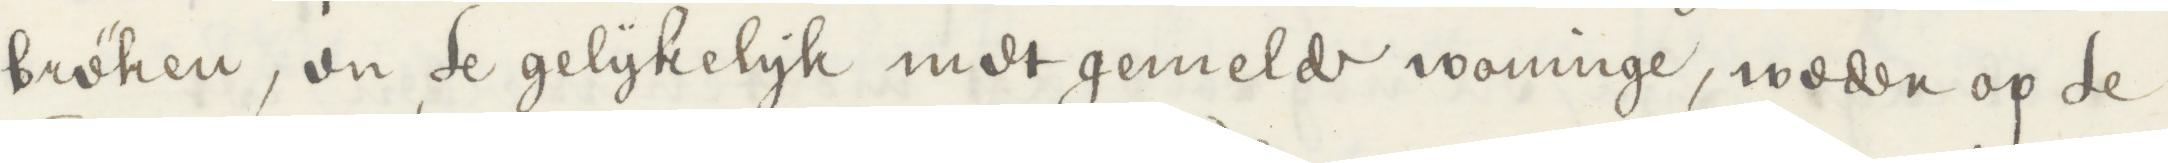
breken, en te gelijkelijk met gemelde woninge, weder op te
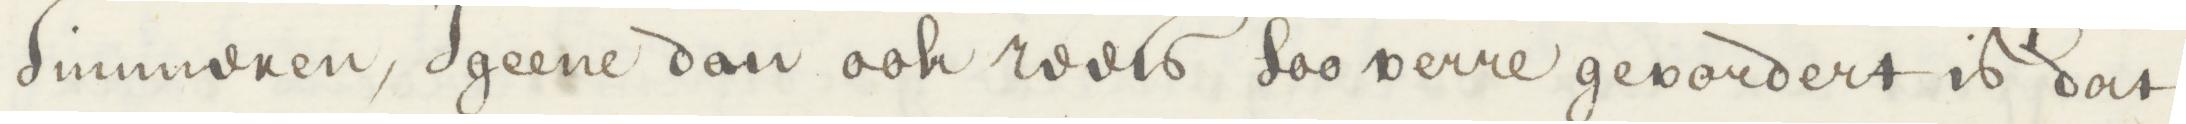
timmeren, 't geene dan ook reets soo verre gevordert is dat
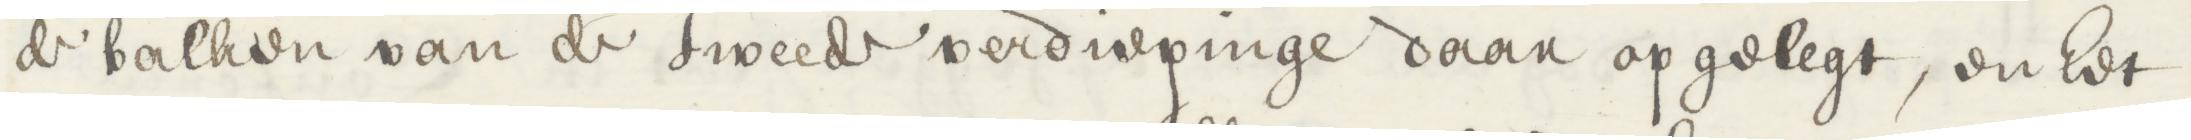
de balken van de tweede verdiepinge daar op gelegt, en het
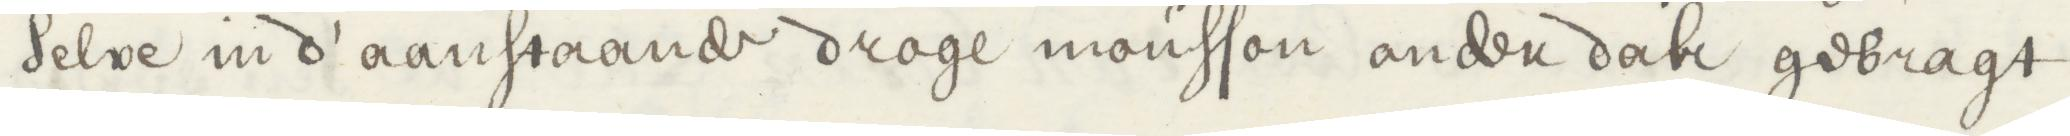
selve in d’ aanstaande droge mousson onder dak gebragt
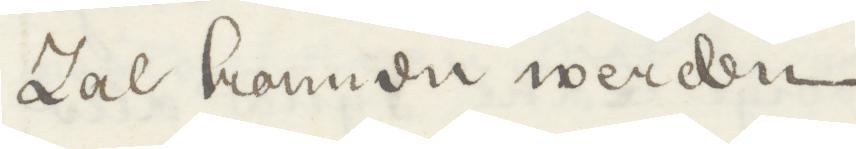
zal konnen werden.
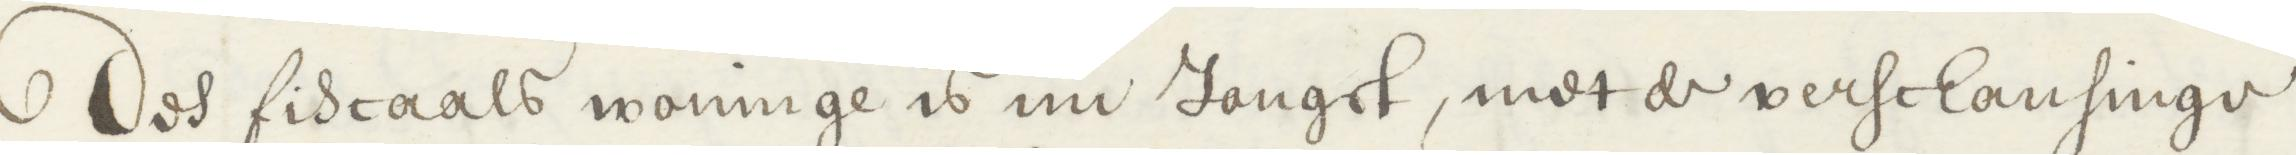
Des fiscaals woninge is nu Jongst, met de verschansinge
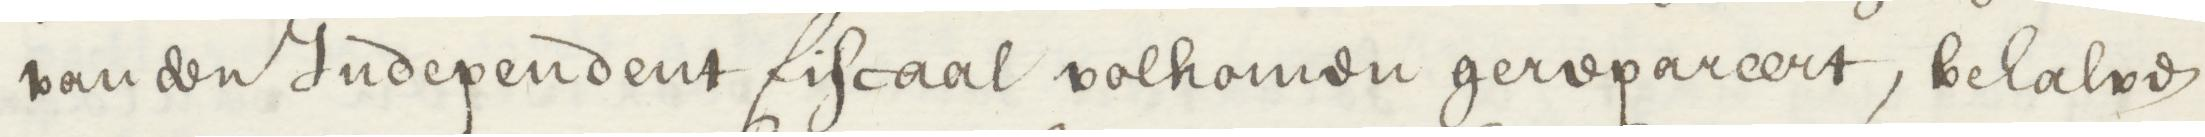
van den Jndependent fiscaal volkomen gerepareert, behalven
